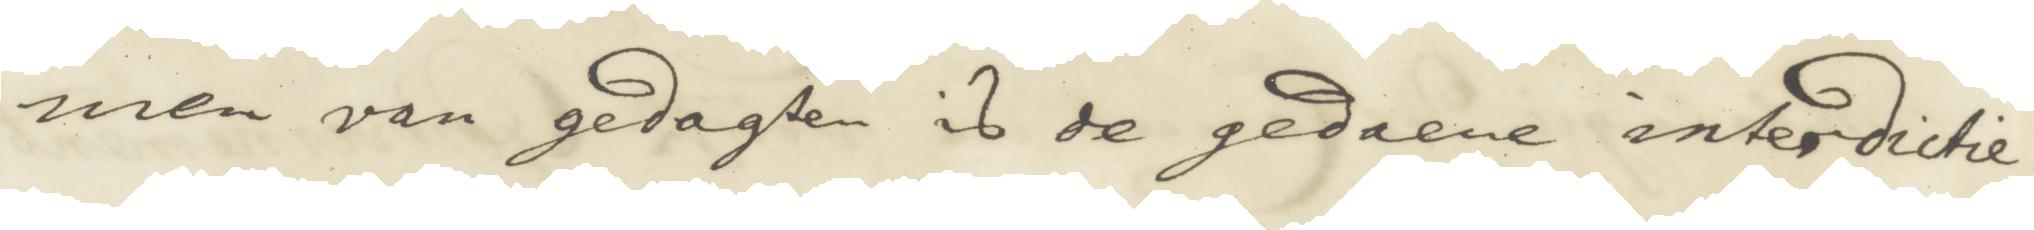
men van gedagten is de gedaene interdictie
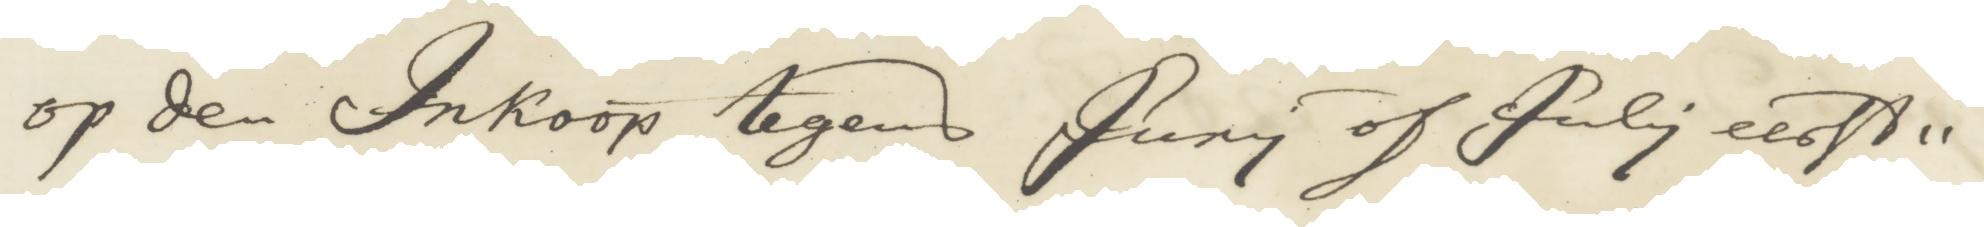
op den Inkoop tegens Junij over Julij eerst„
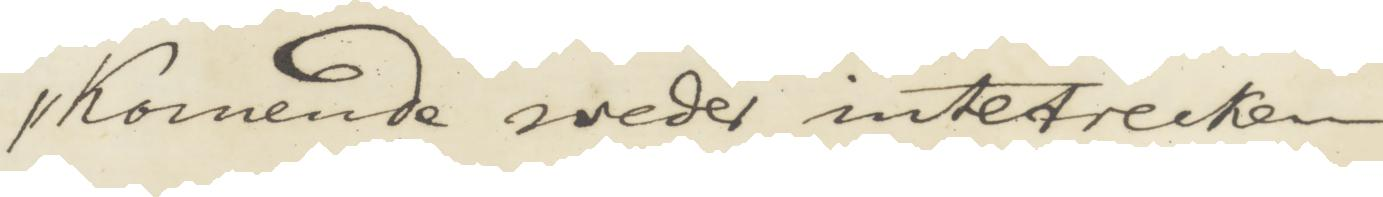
„komende weder intetrecken
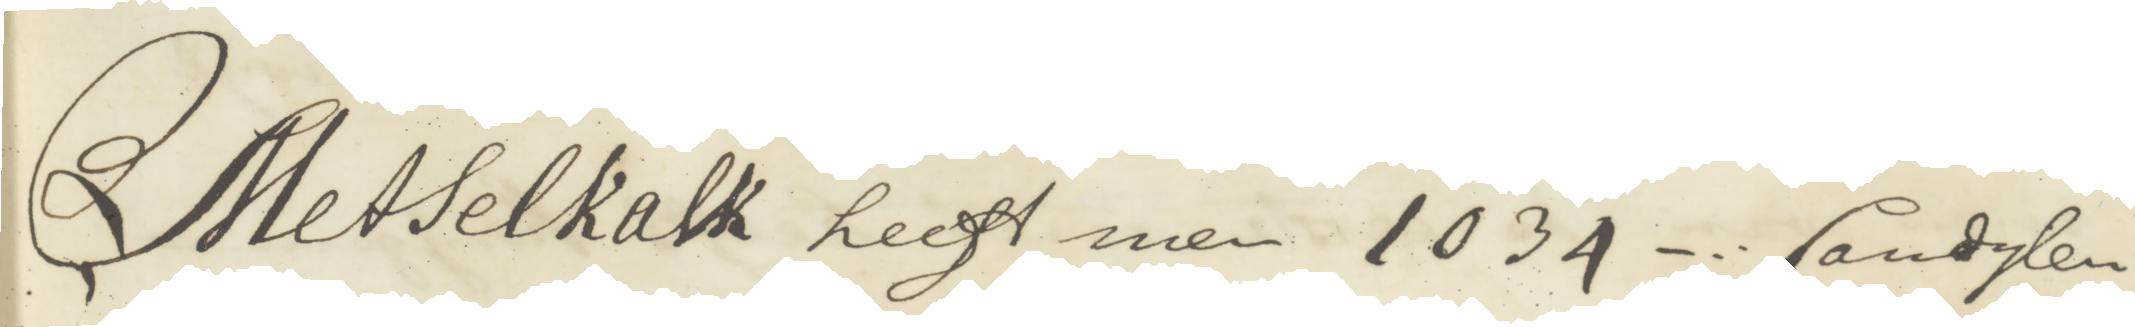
Metselkalk heeft men 1034 —: Candylen
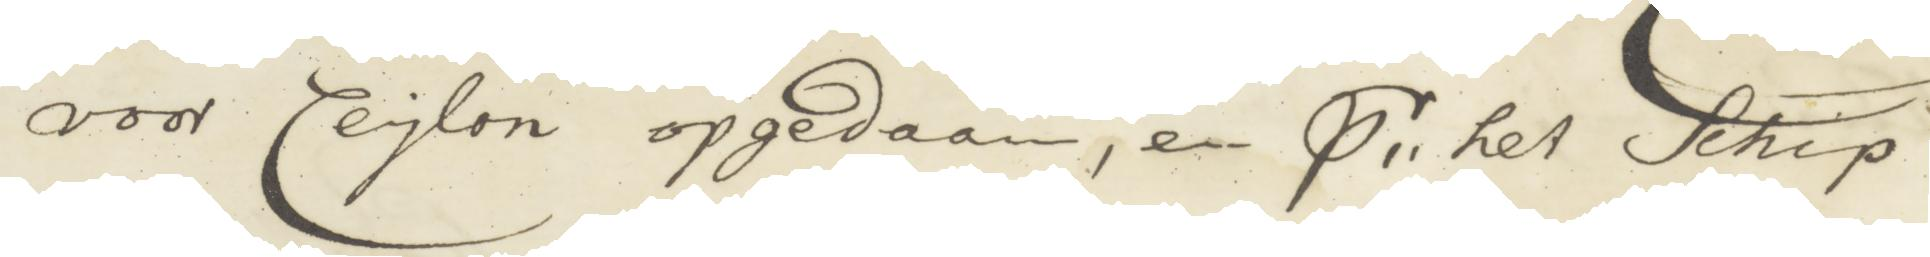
voor Ceijlon opgedaan, en p„r het schip
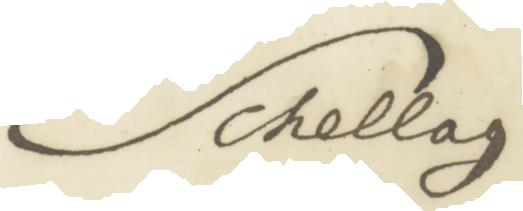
schellag
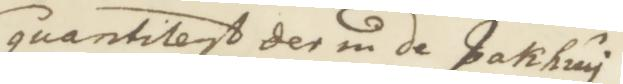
quantiteijt der in de pakhuij
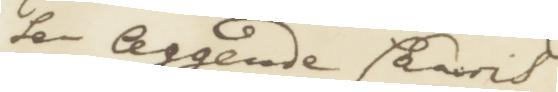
sen leggende Cauris
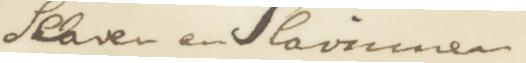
Slaven en Slavinnen
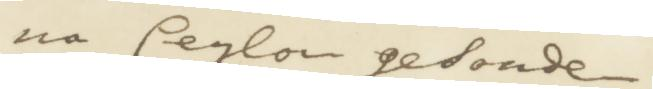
na Ceylon gesonden
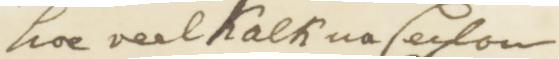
hoe veel kalk na Ceylon
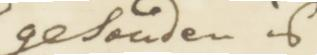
gesonden is
